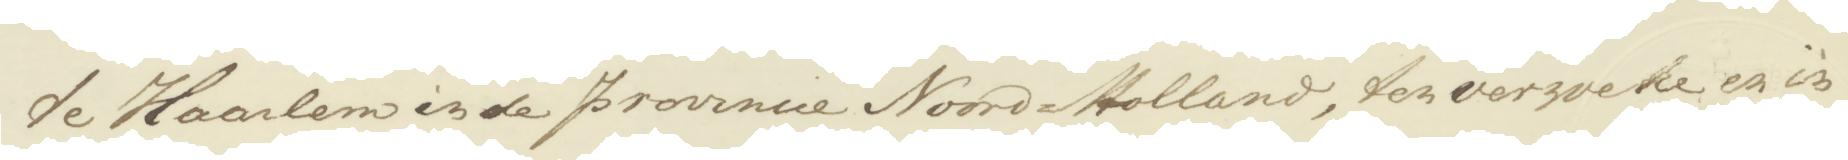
Te Haarlem in de provincie Noord= Holland, ten verzoeke en in
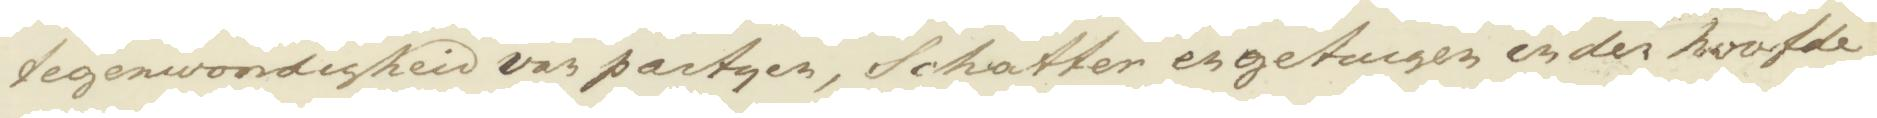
tegenwoordigheid van partyen, schatter en getuigen en den hoofde
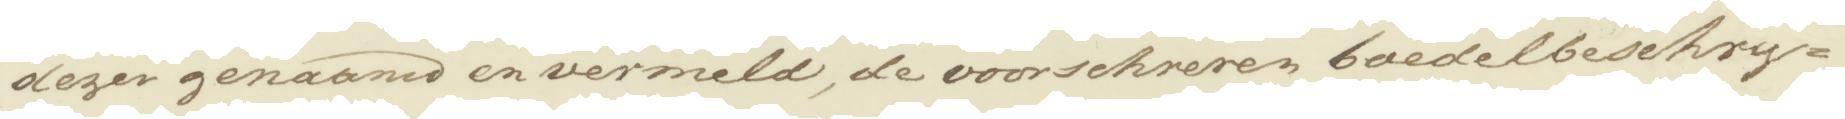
dezer genaamd en vermeld, de voorschreven boedelbeschry=
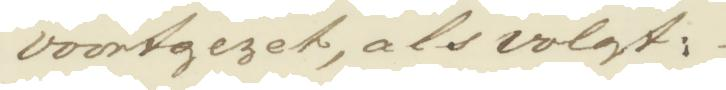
voortgezet, als volgt:
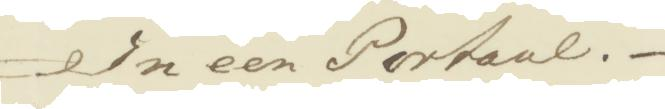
In een Portaal.-
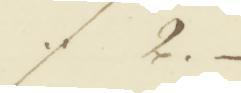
ƒ 2. -
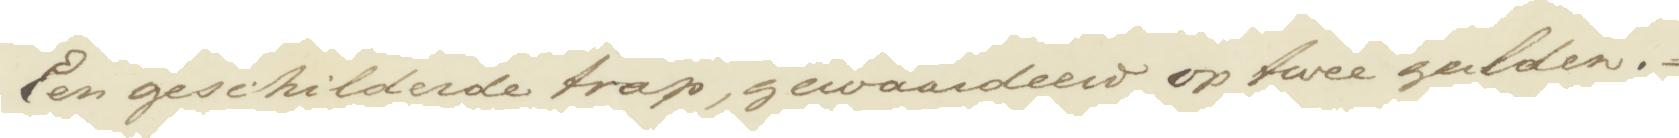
Een geschilderde trap, gewaardeerd op twee gulden.-
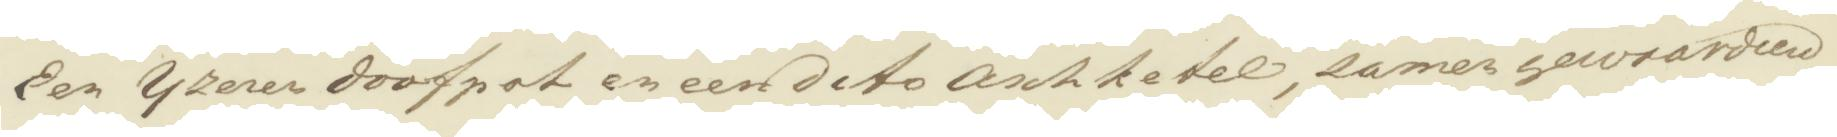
Een Yzeren doofpot en een dito aschketel, zamen gewaardeerd
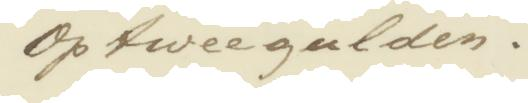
Op twee gulden.
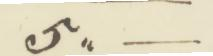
ƒ 5„ —
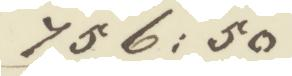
756: 50
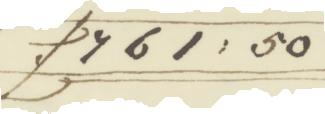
ƒ761: 50
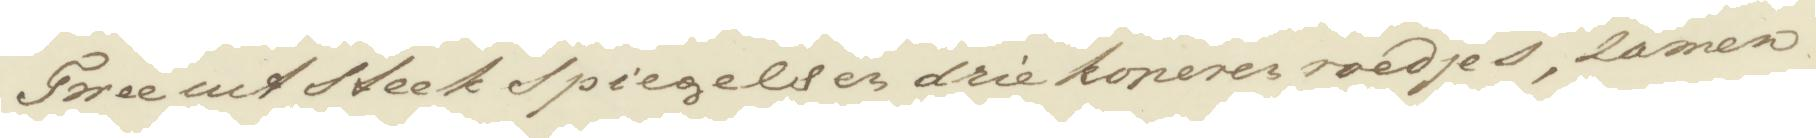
Twee uit steek spiegels en drie koperen voedjes, zamen
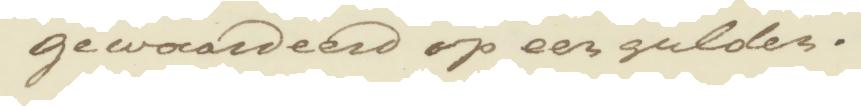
gewaardeerd op een gulden.
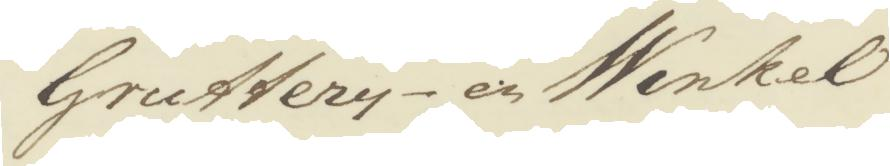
Gruttery- en Winkel
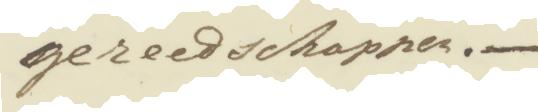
gereedschappen.—
